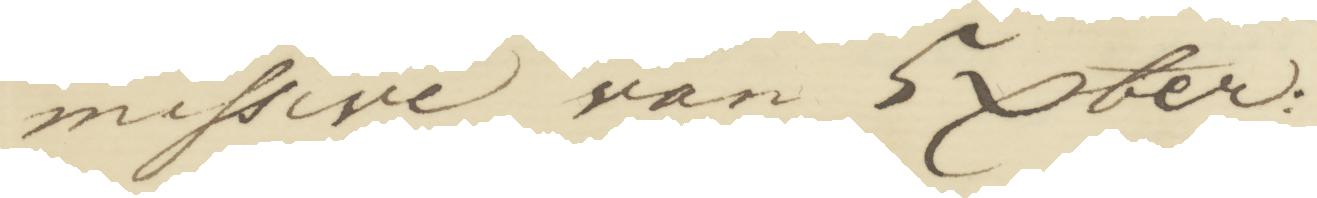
missive van 5 xber:
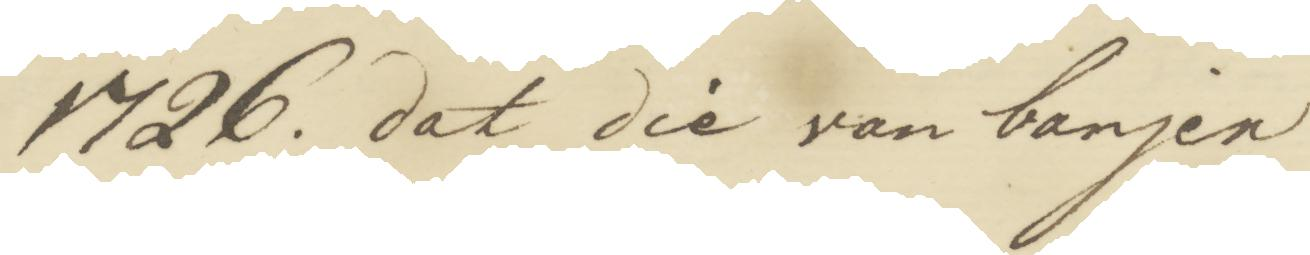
1726. dat die van banjer
